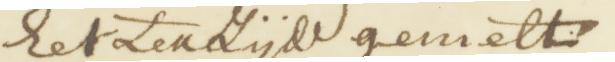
het terzijde gemelt
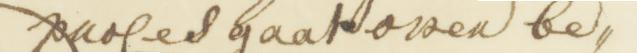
proces gaat over be„
